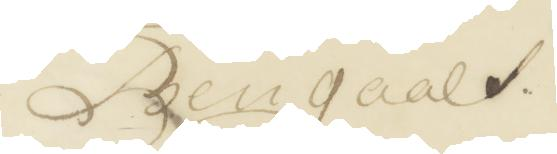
Bengaals.
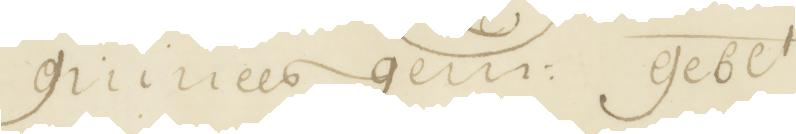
guinees gem: geblt
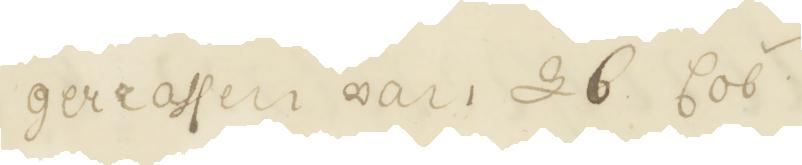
gerrassen van 36. cob
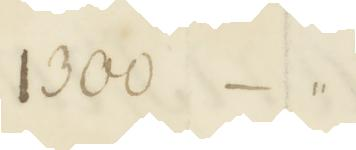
1300 - „
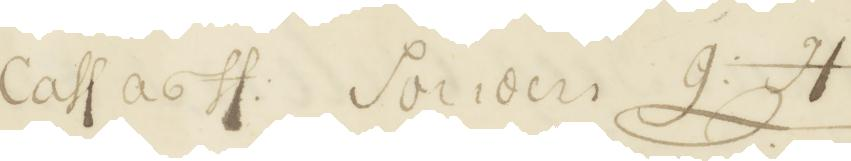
Cassas ff: souden g: it
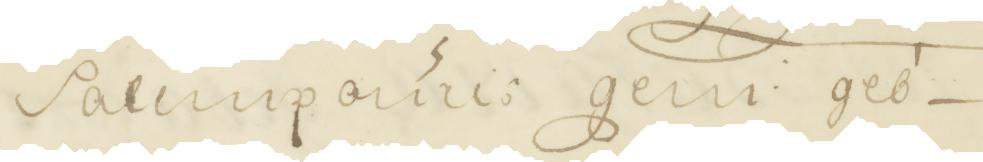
Salimpouris gem: gebt_
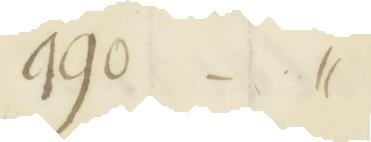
490 _ „
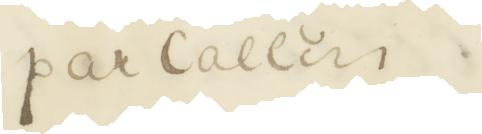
parcallen
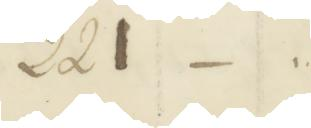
221 _ „
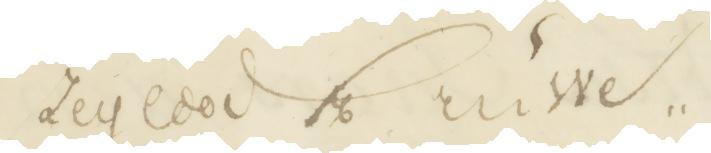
zeyldoek ruwe „
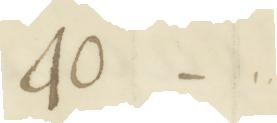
40 _ „
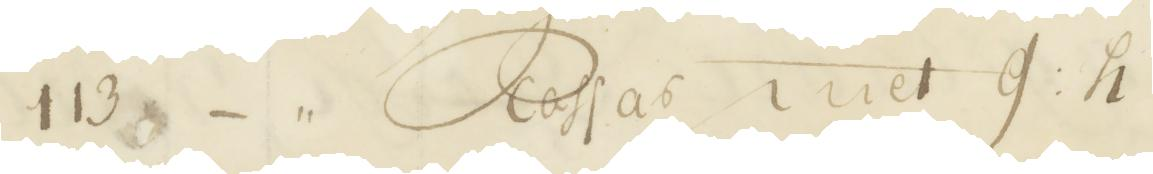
113 _ „ cassas met g:h
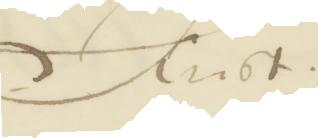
Kust
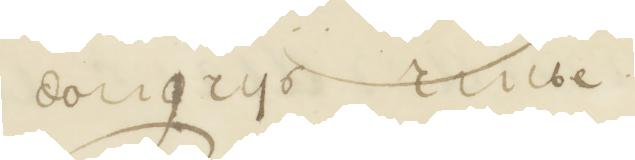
dongrijs ruwe
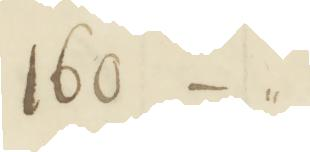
160 - „
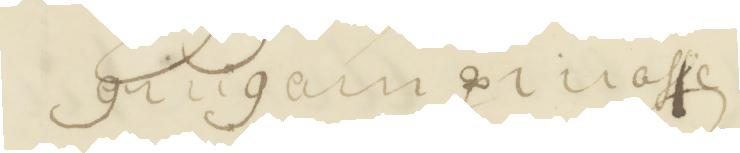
guigam pmasse
